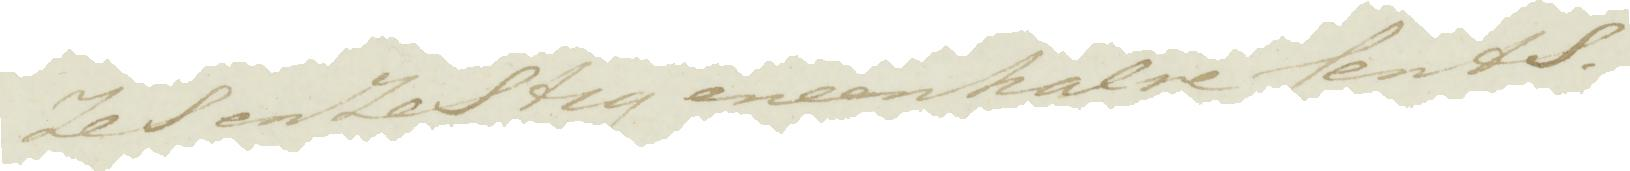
Zes en Zestig en een halve Cents.
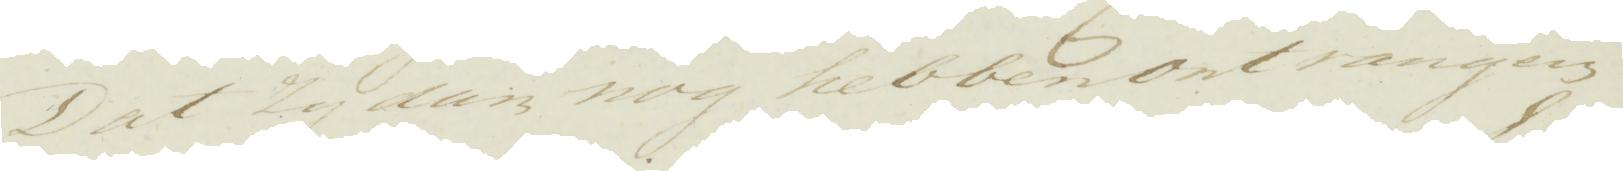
Dat zy dan nog hebben ontvangen
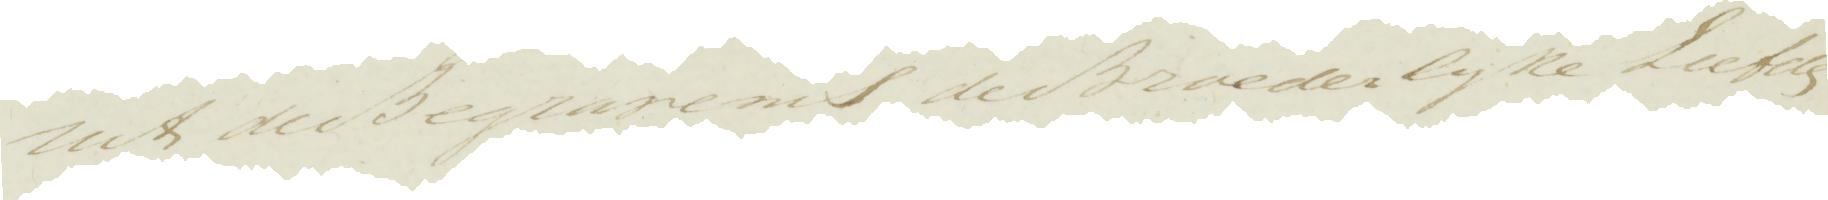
uit de Begravenis de Broederlyke Liefde
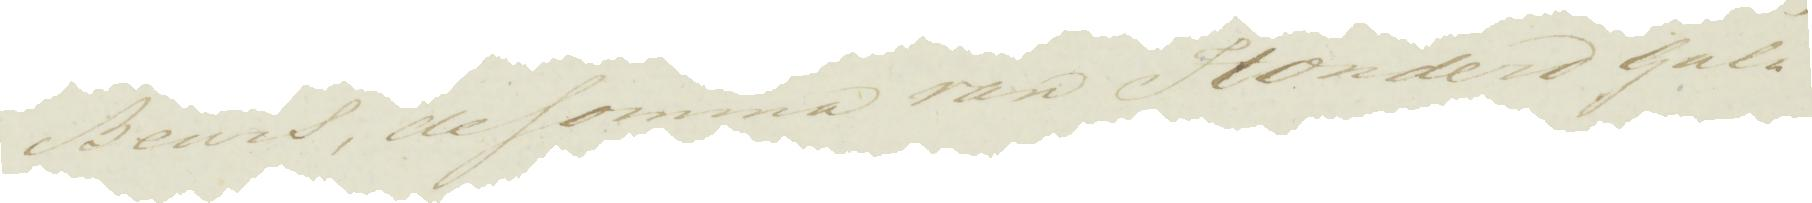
Beurs, de somma van Honderd Gul„
